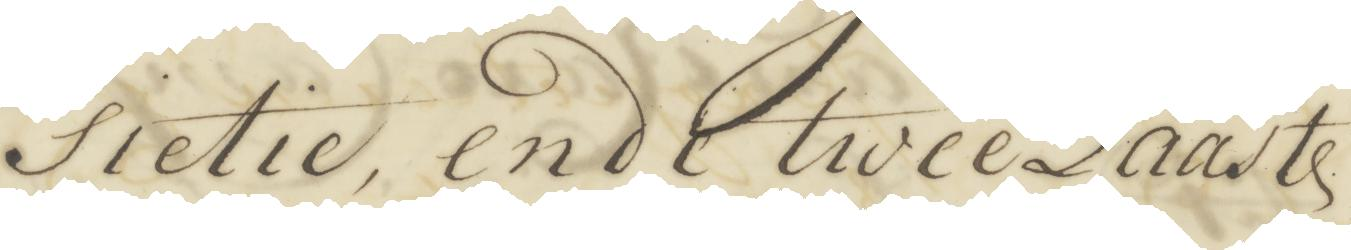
sietie, ende twee Laasten
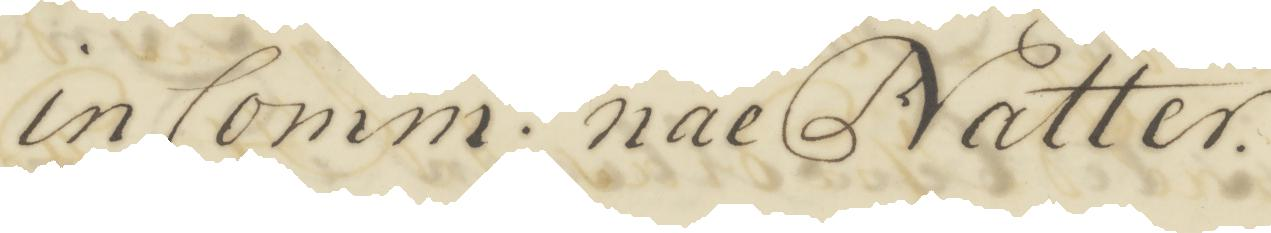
in Comm. nae Natter.
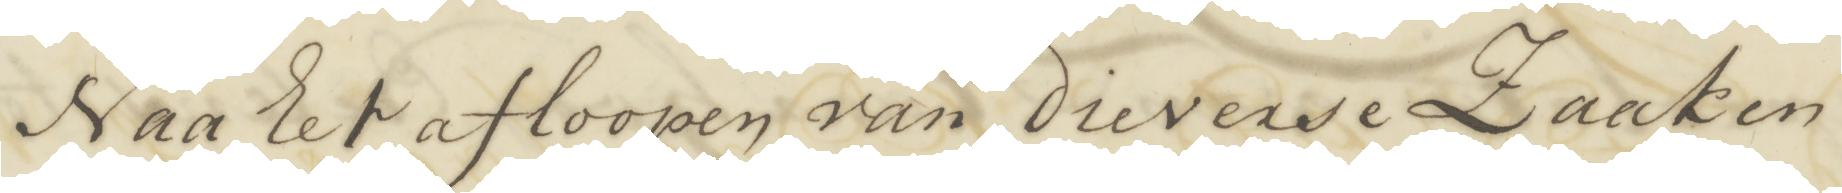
Naa het afloopen van dieverse Zaaken
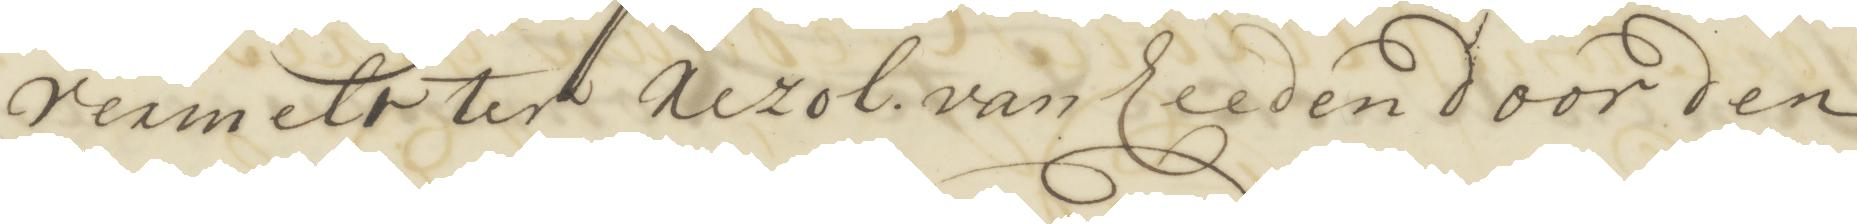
vermelt ter rezol. van heeden door den
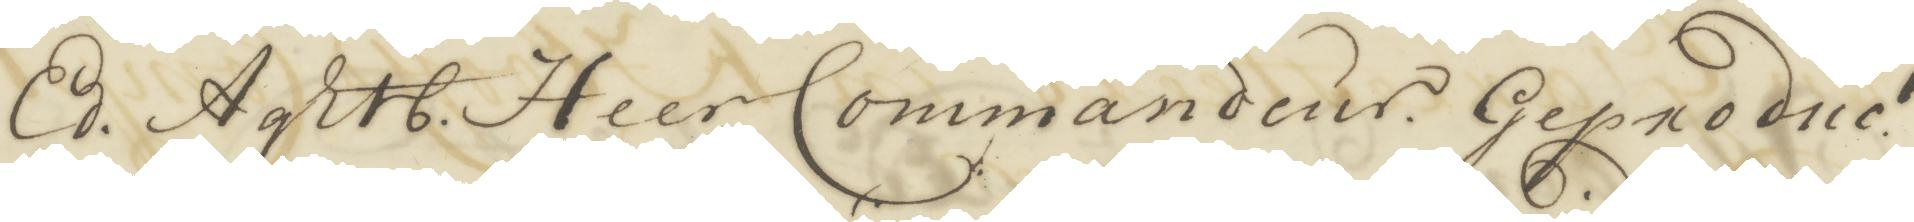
Ed:. Aghtb: Heer Commandeur. Geproduc.t
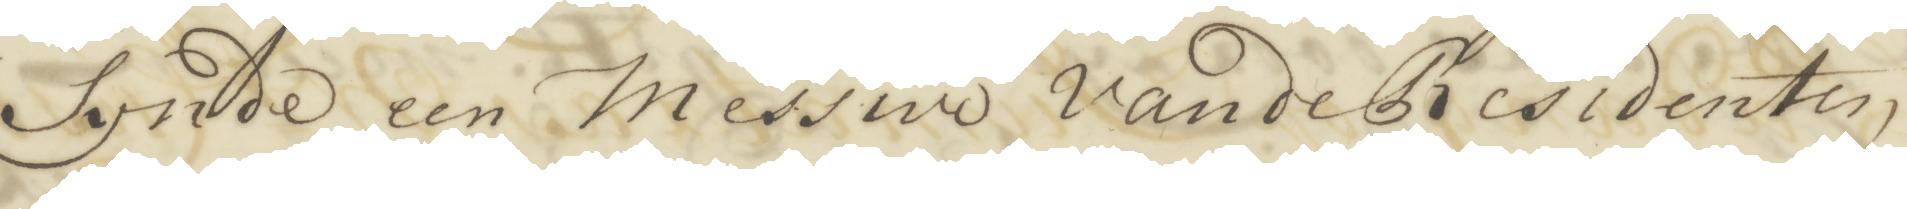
synde een messive van de Residenten
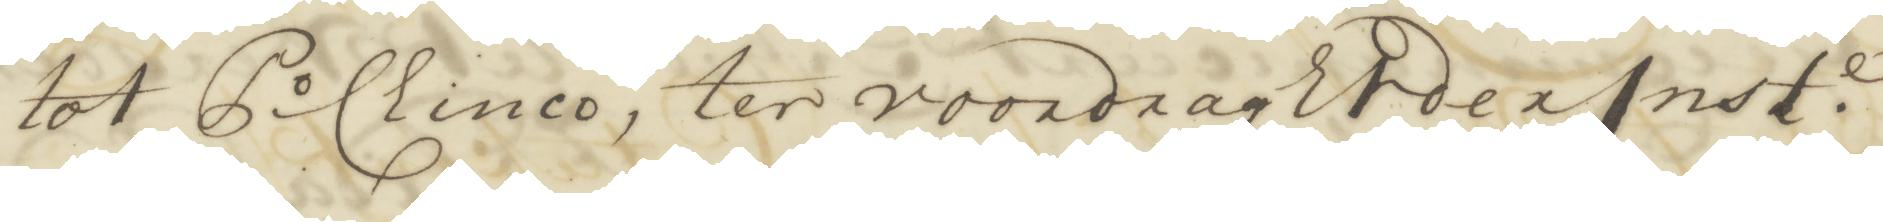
tot Po Chinco, ter voordraght der Inst.e
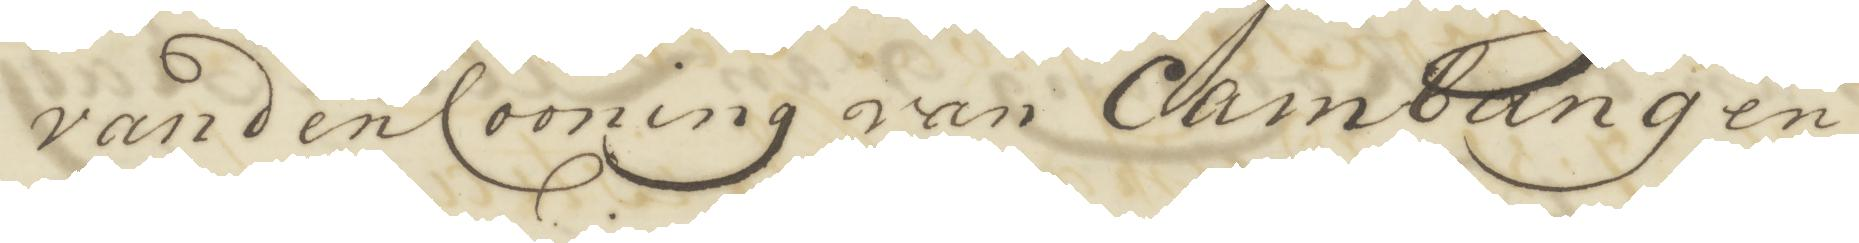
van den Cooning van Cambang en
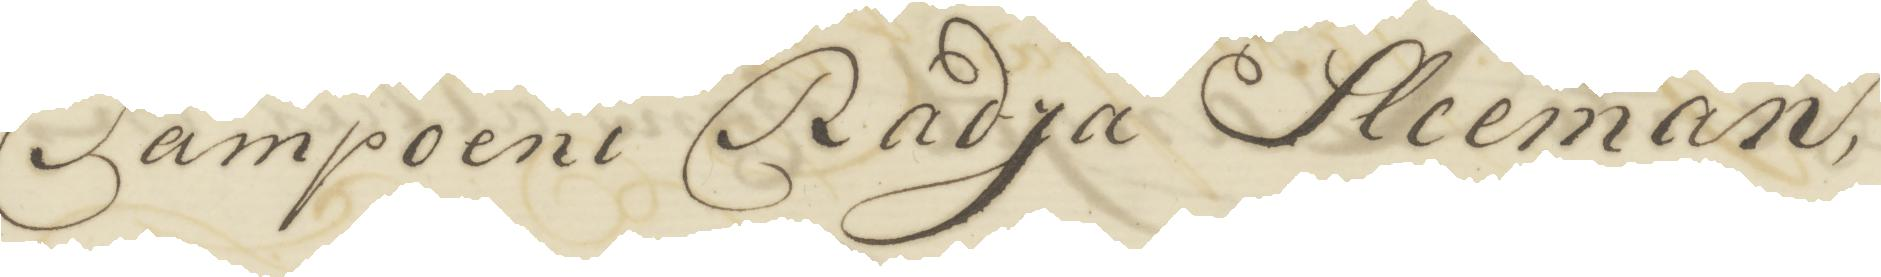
Tampoeni Radja Sleeman,
